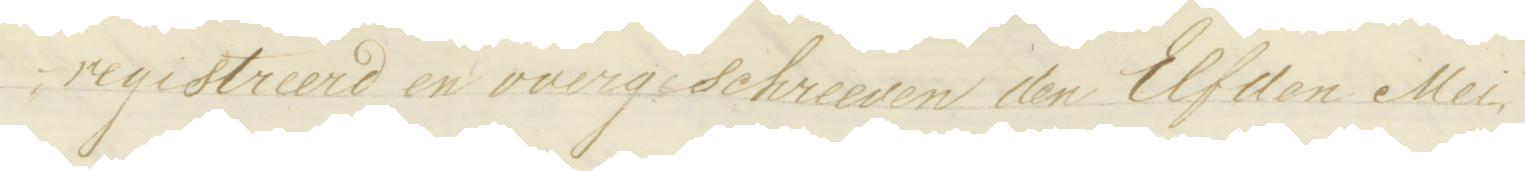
„registreerd en overgeschreeven den Elfden Mei,
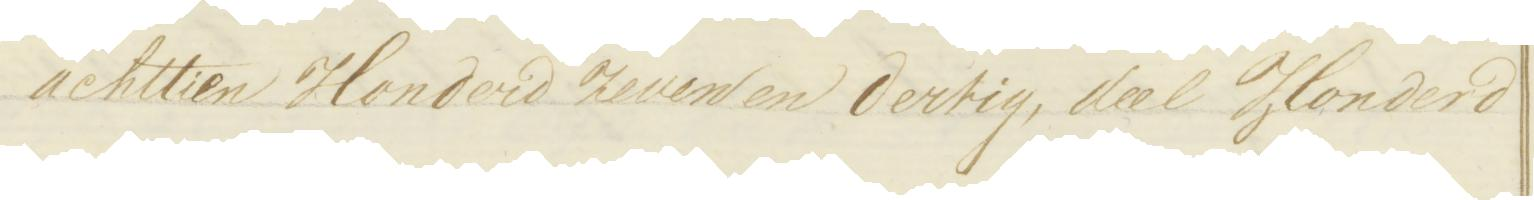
achttien Honderd zeven en dertig, deel Honderd
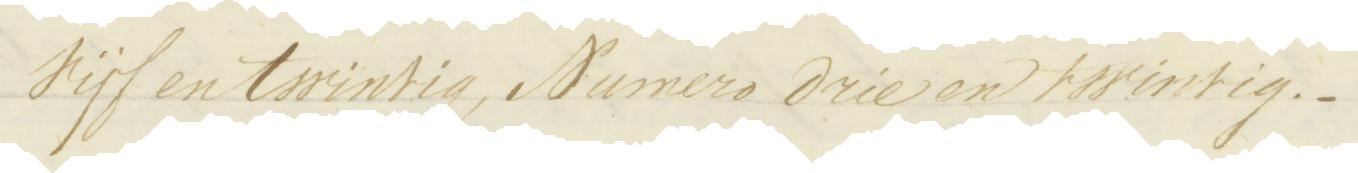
Vijf en twintig, Numero drie en twintig. —
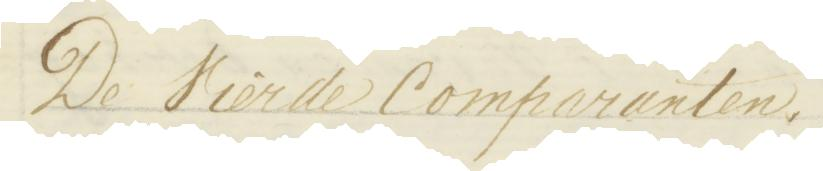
De Vier de Comparanten.
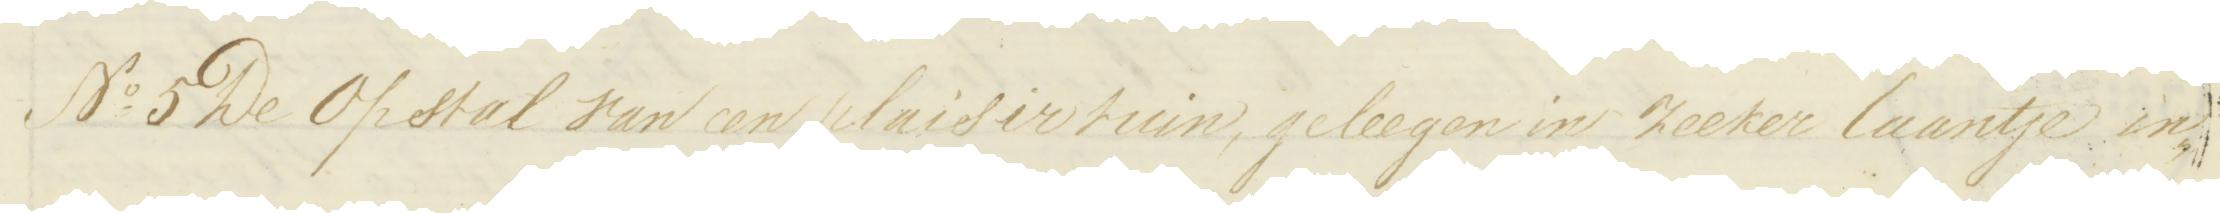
N=o 5 De Opstal van een plaisirtuin, geleegen in zeeker laantje in„
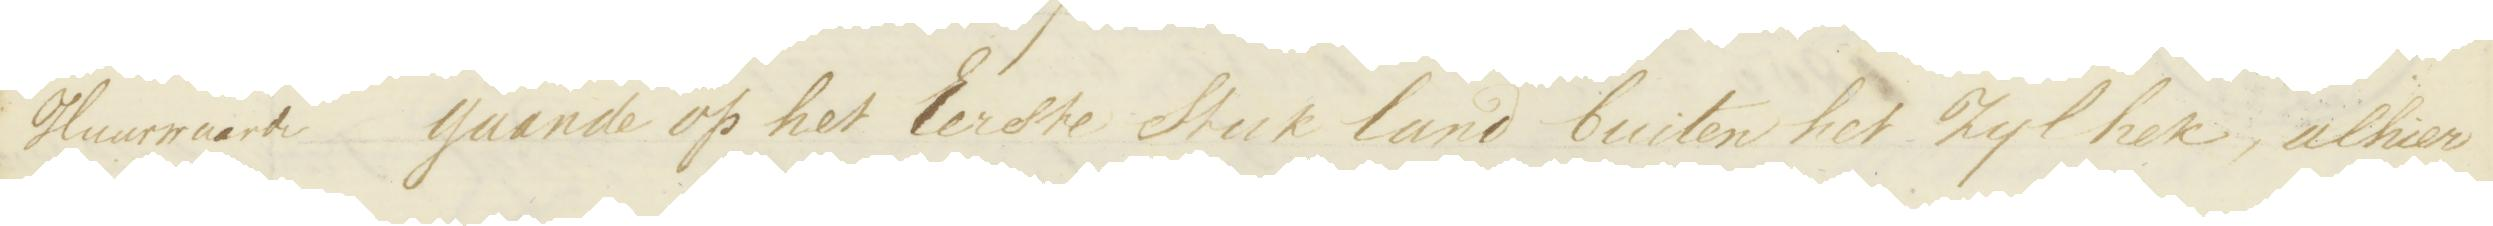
Huurwaarde gaande op het Eerste stuk land buiten het Zylhek, alhier
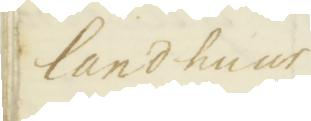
landhuur
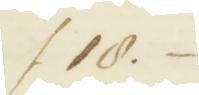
ƒ 18. —
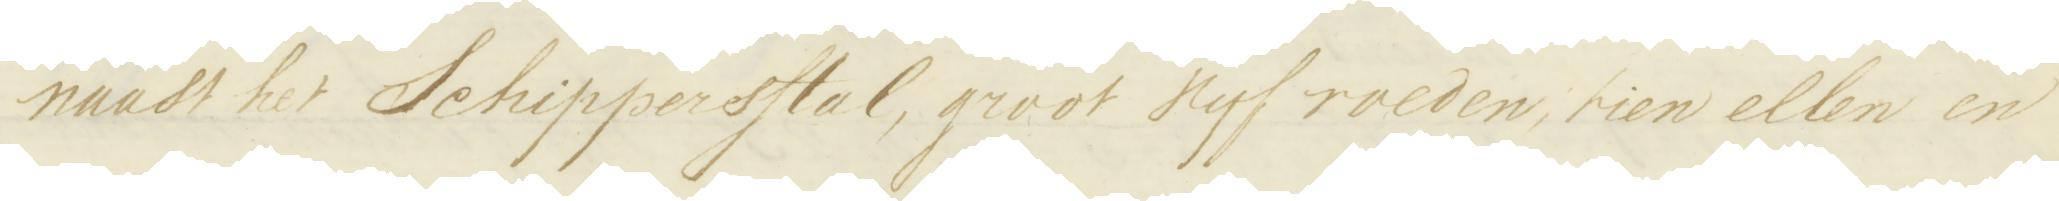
naast het Schippersstal, groot vyf roeden, tien ellen en
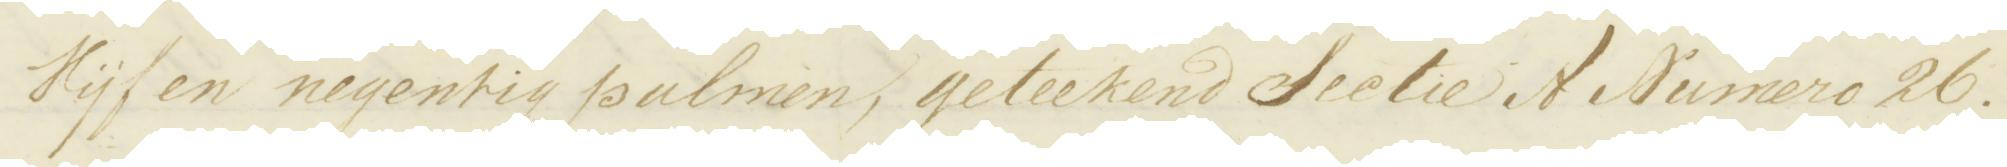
Vijf en negentig palmen, geteekend Sectie A Numero 26.
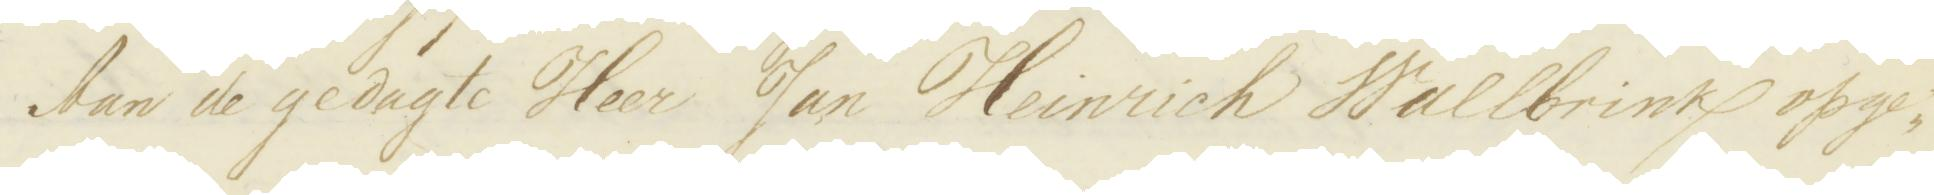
Aan de gedagte Heer Jan Heinrich Wallbrink opge„
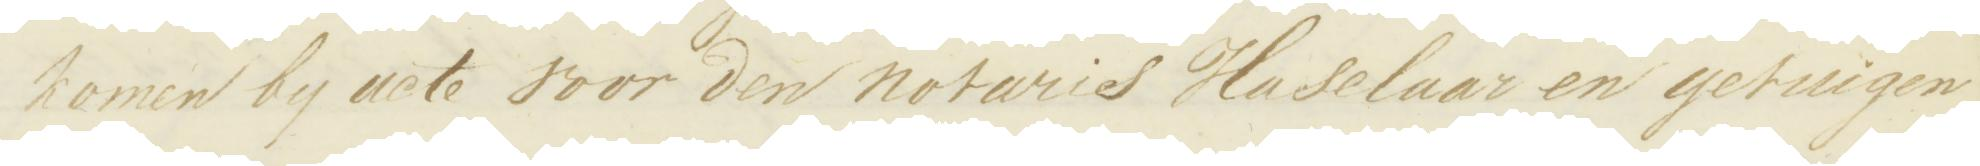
komen by acte voor den notaris Haselaar en getuigen
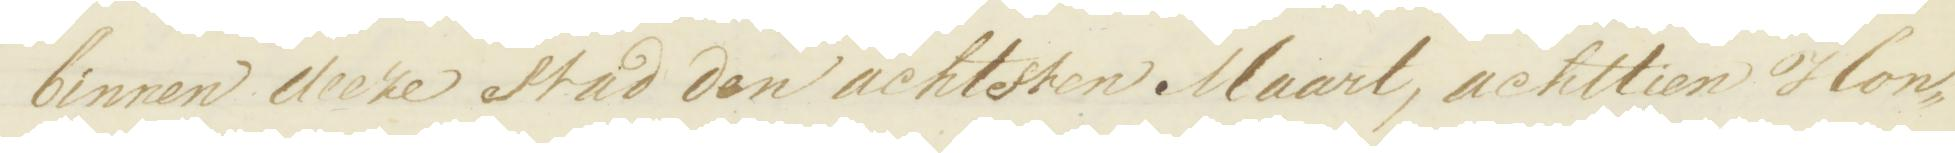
binnen deeze stad den achtsten Maart, achttien Hon„
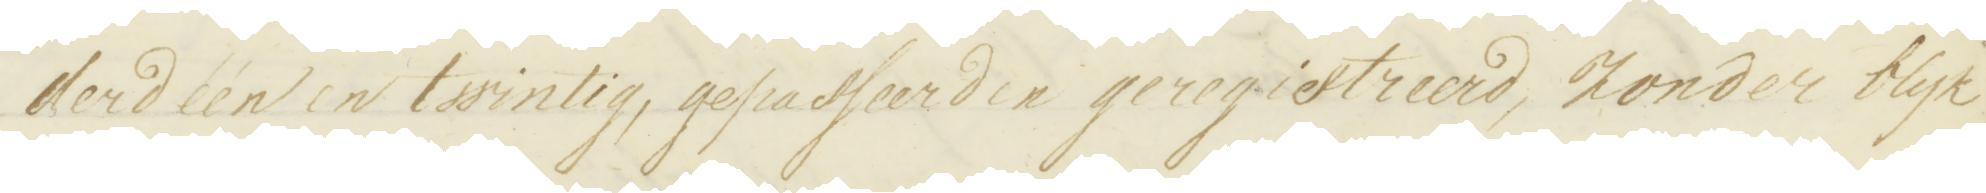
derd één en twintig, gepasseerd en geregistreerd, zonder blyk
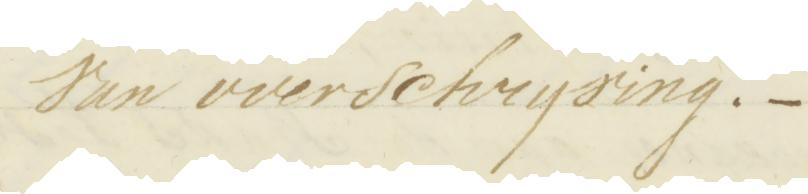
van overschryving. —
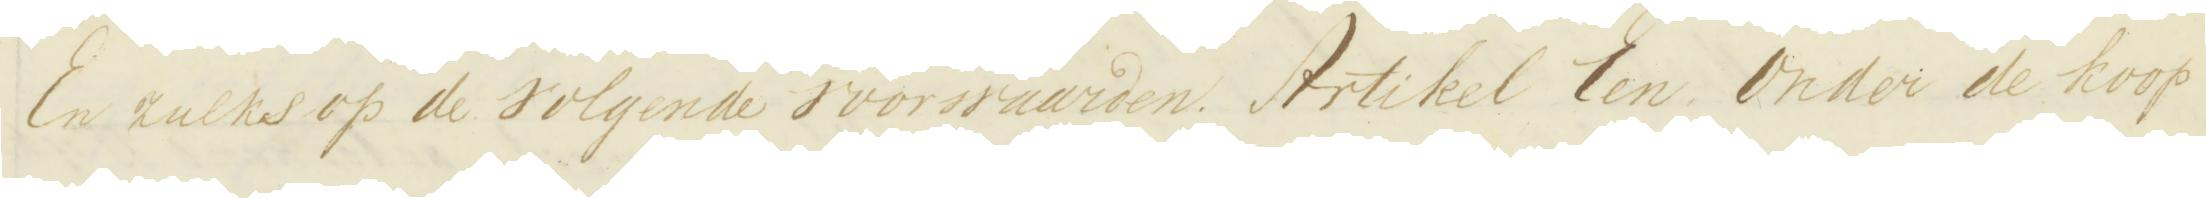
En zulks op de volgende voorwaarden. Artikel Een. Onder de koop
